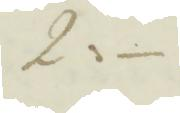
2 : —
